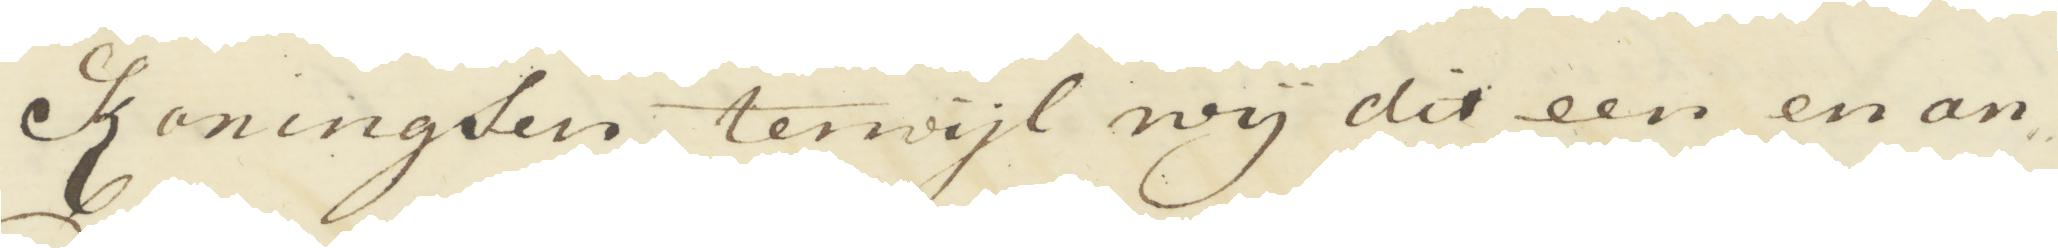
Koningsen, terwijl wij dit een en an„
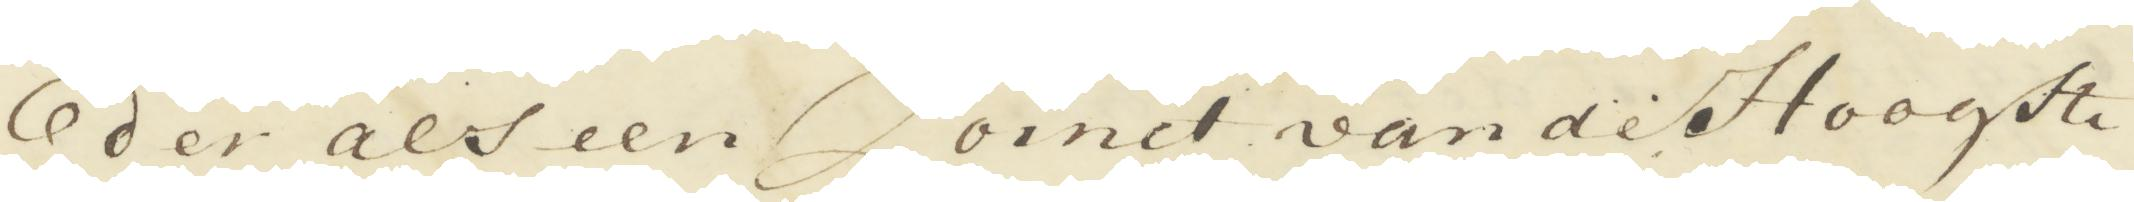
der als een Poinct van de Hoogste
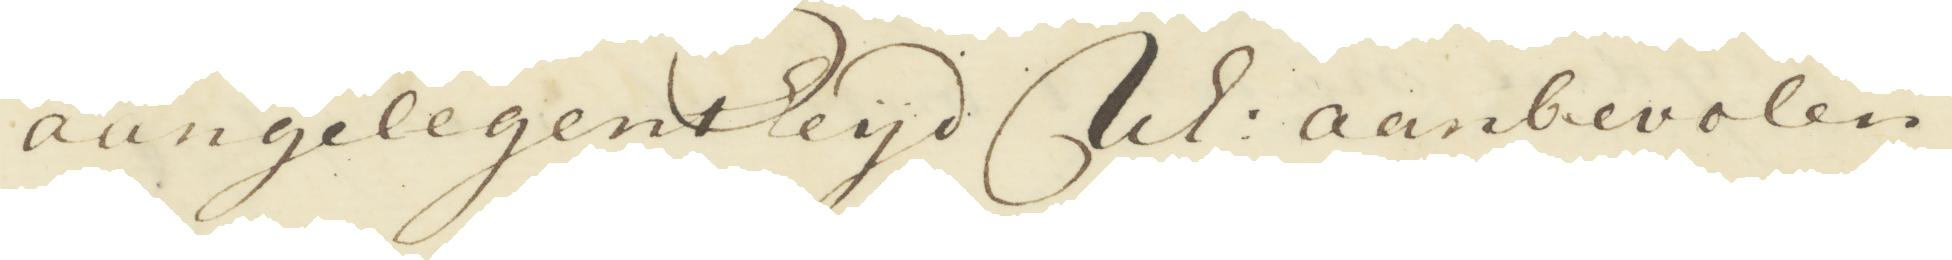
aangelegentheijd UE: aanbevolen
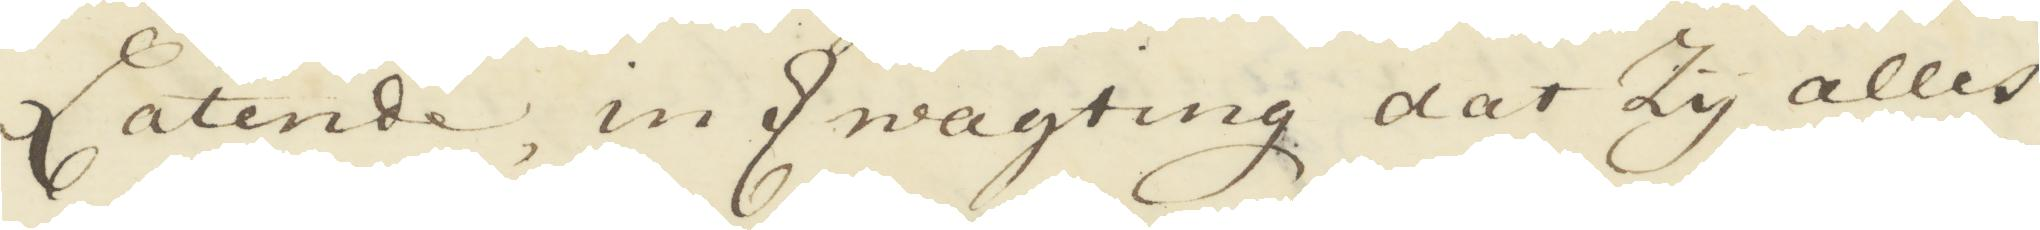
Latende, in verwagting dat zij alles
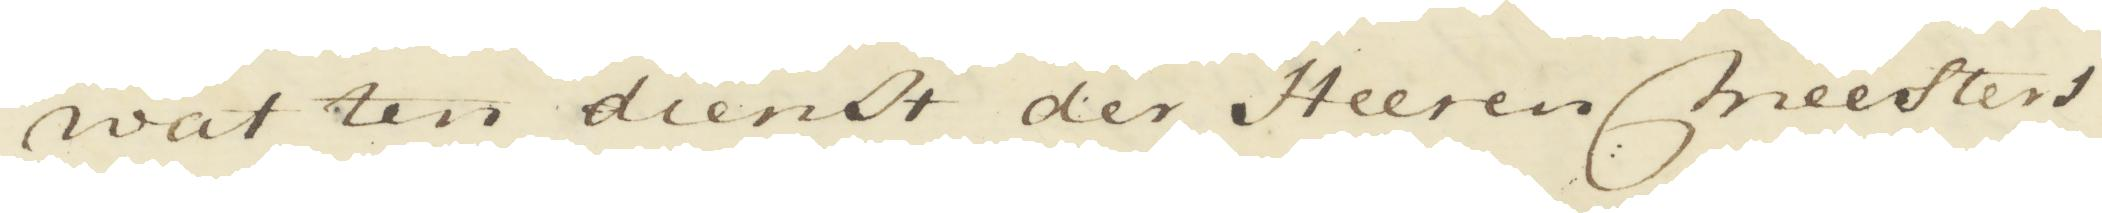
wat ten dienst der Heeren meesters
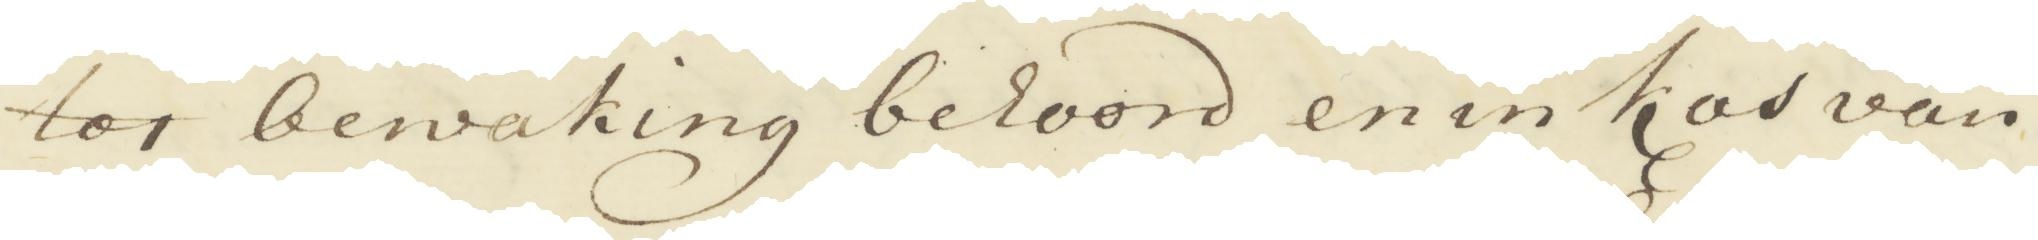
tot bewaking behoord en in kas van
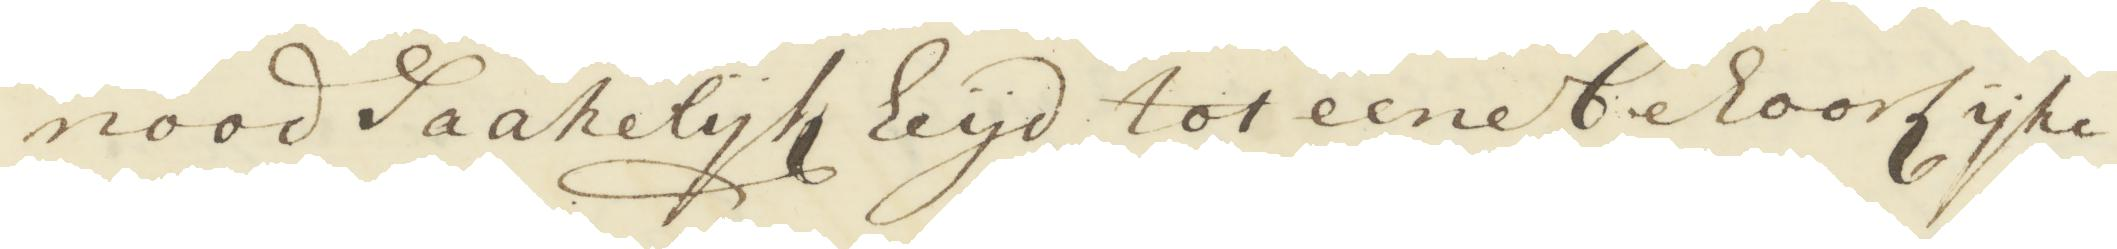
noodsaakelijkheijd tot eene behoorlijke
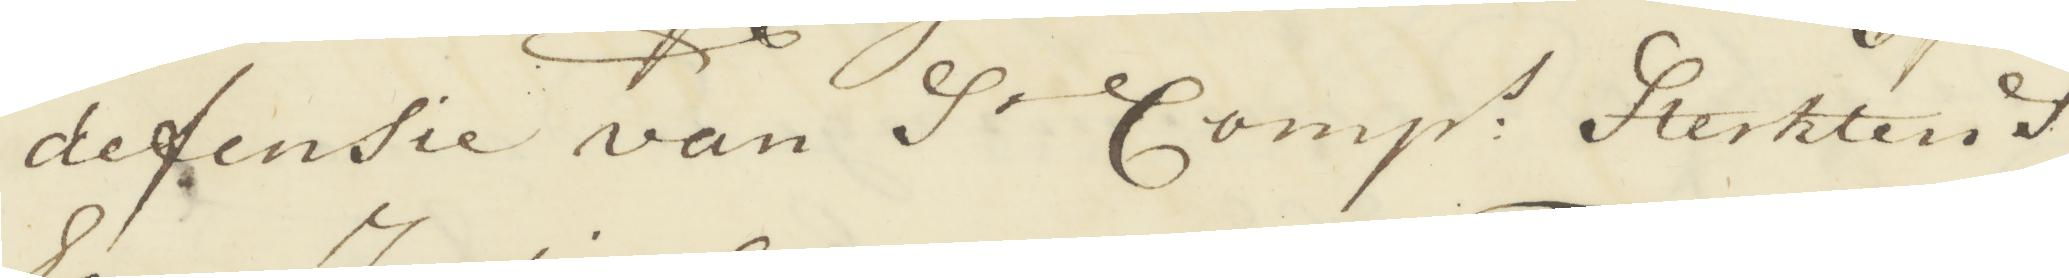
defensie van s' Comp:s Sterktens
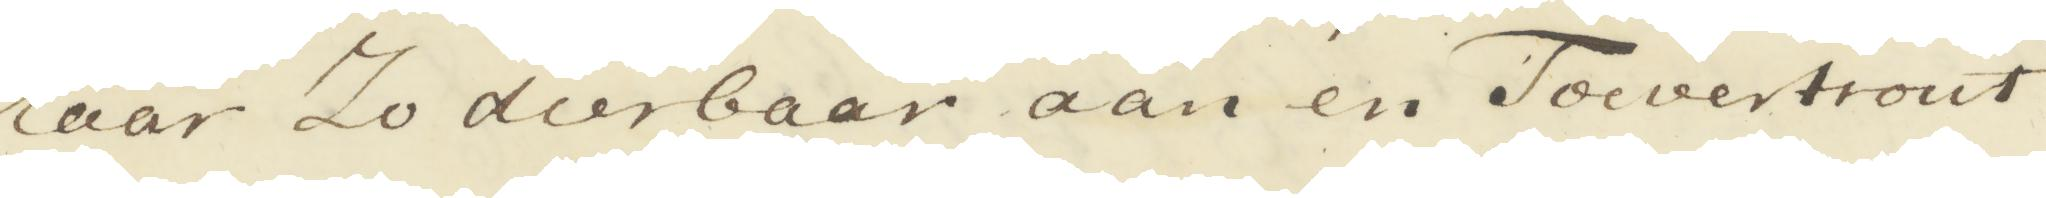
haar zo dierbaar aan en Toevertrout
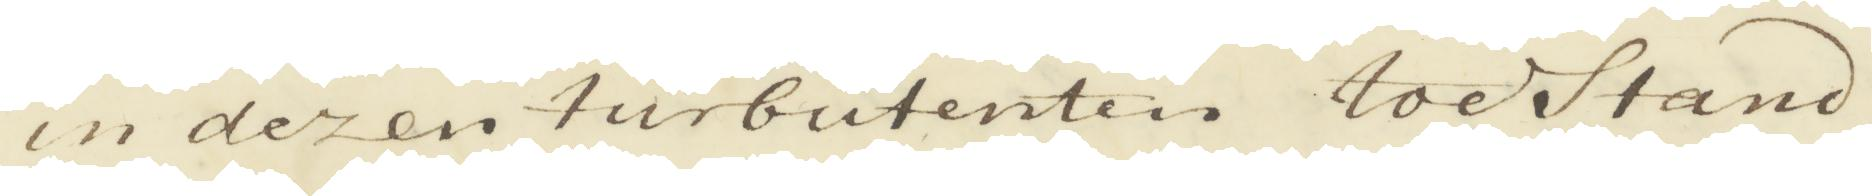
in dezen turbutenten toestand
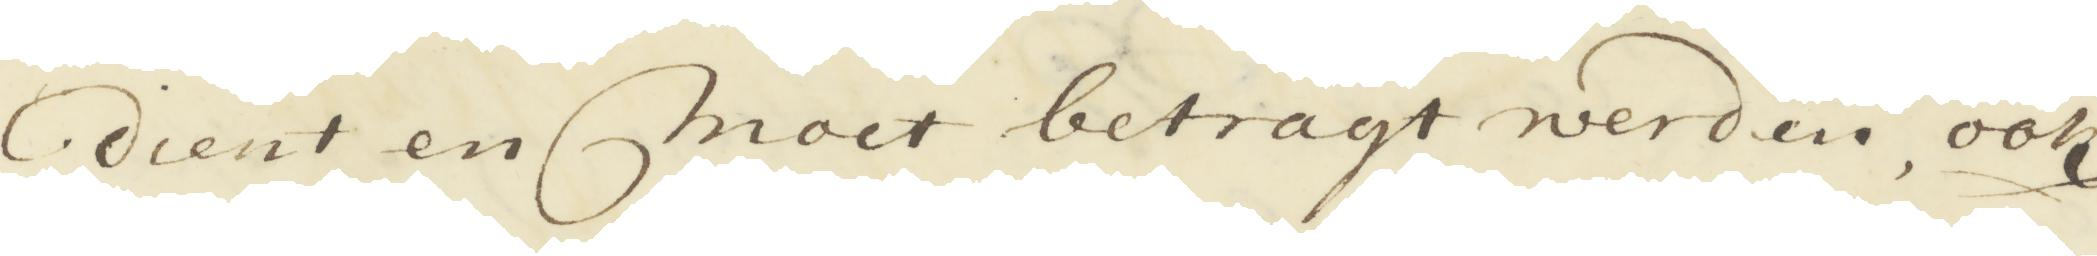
dient en moet betragt werden, ook
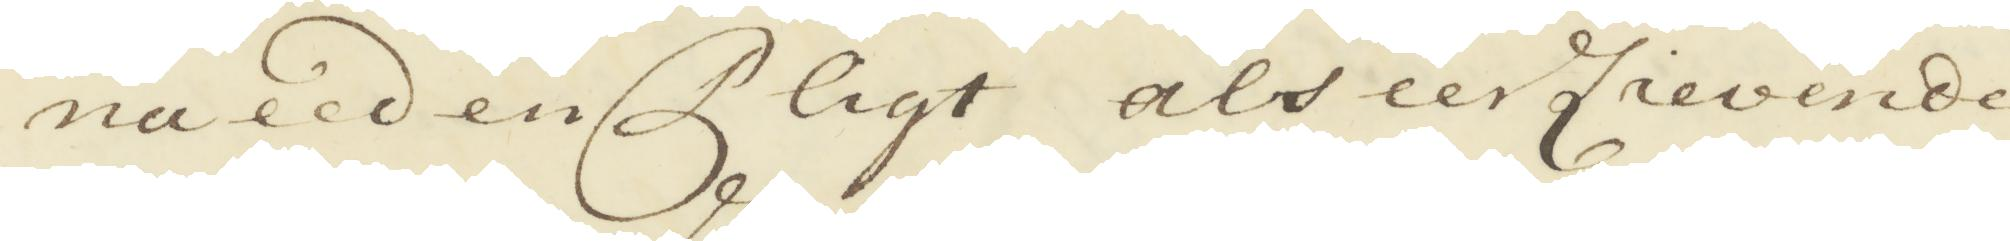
na eed en Pligt als eerlievende
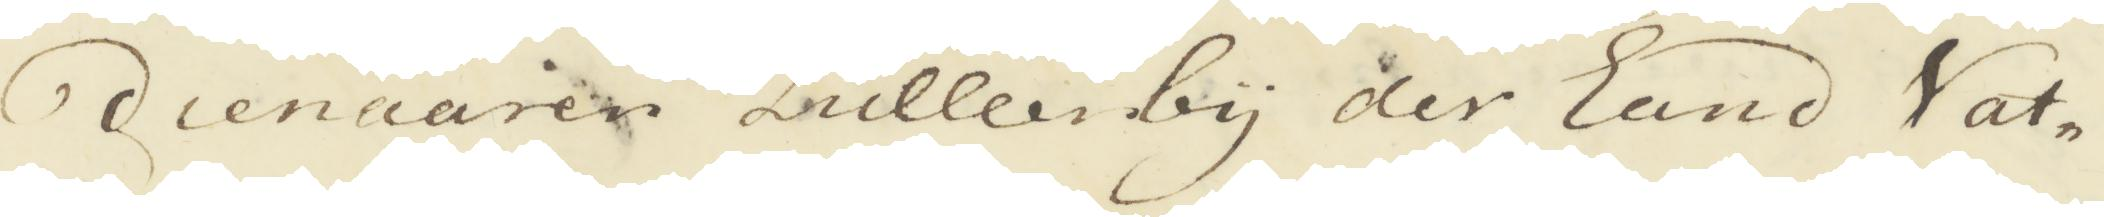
dienaaren zullen bij der hand Vat„
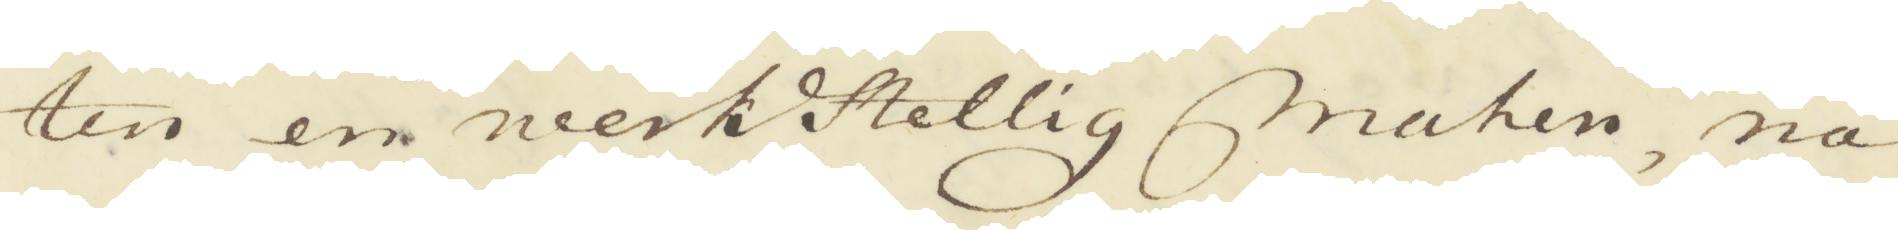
ten en werkstellig maken, na
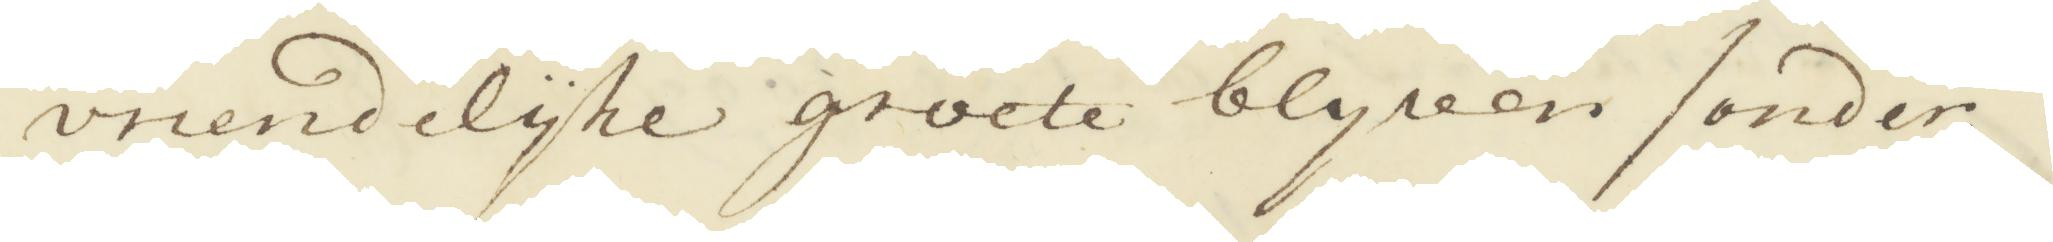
vriendelijke groete blyven /onder
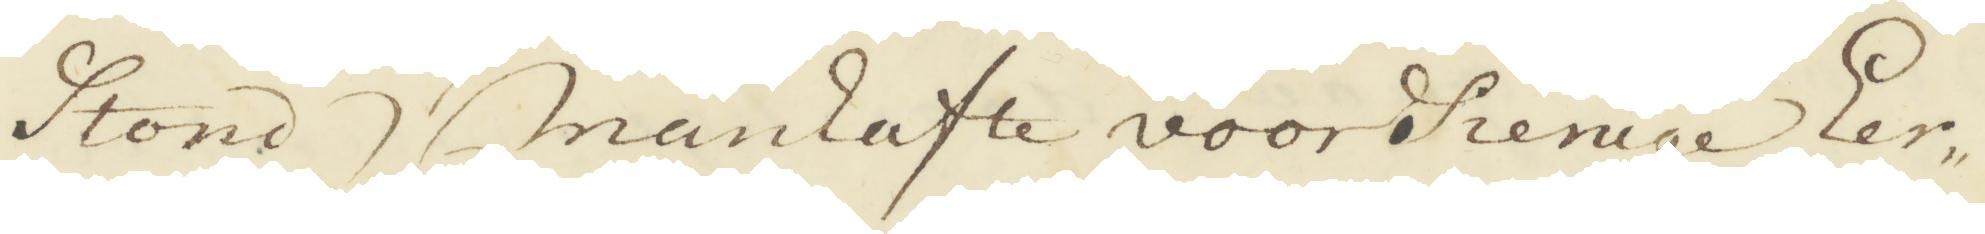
stond) manhafte voorsienige Eer„
